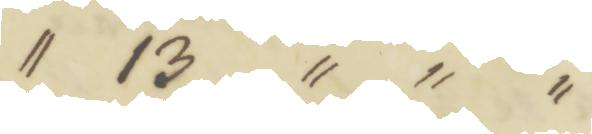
„ 13 „ „ „
